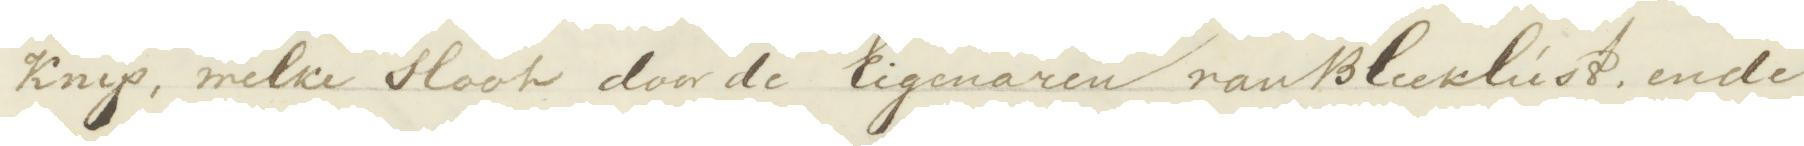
Knip, welke sloot door de Eigenaren van Bleeklust, ende
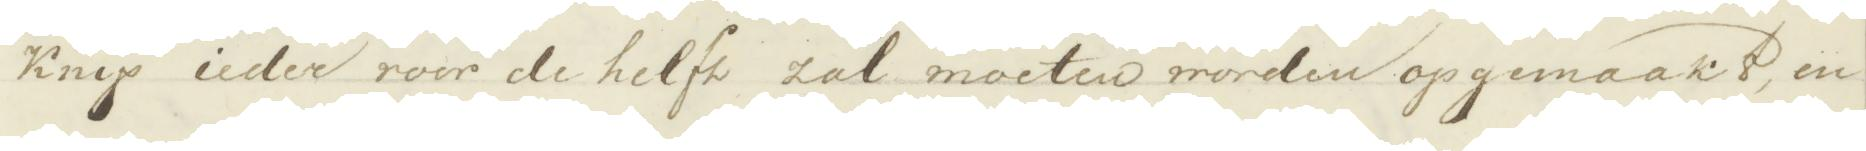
Knip ieder voor de helft zal moeten worden opgemaakt, en
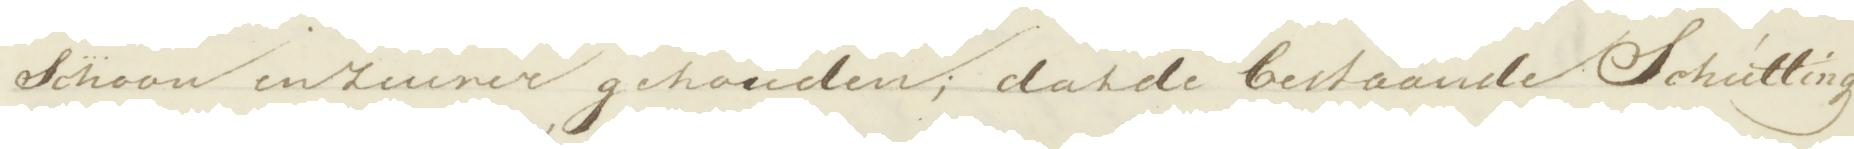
schoon en zuiver gehouden; dat de bestaande Schutting
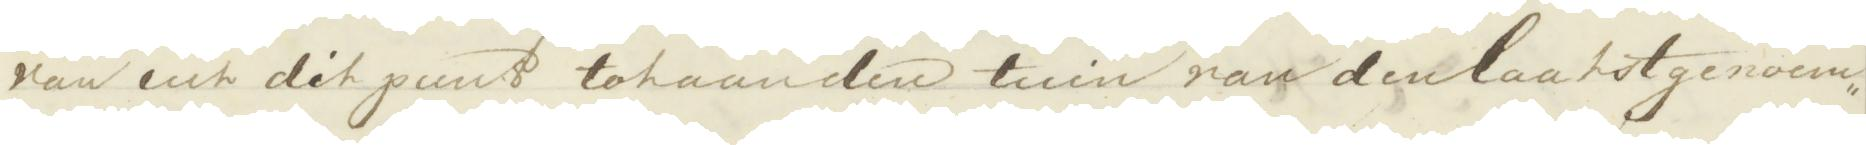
van uit dit punt tot aan den tuin van den laatstgenoem„
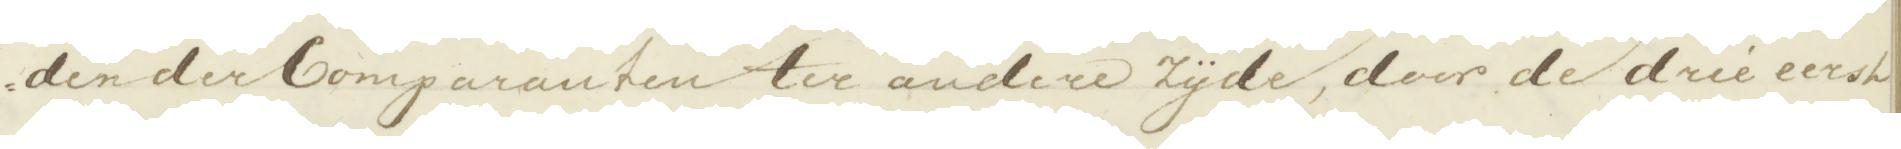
=den der Comparanten ter andere zijde, door de drie eerst
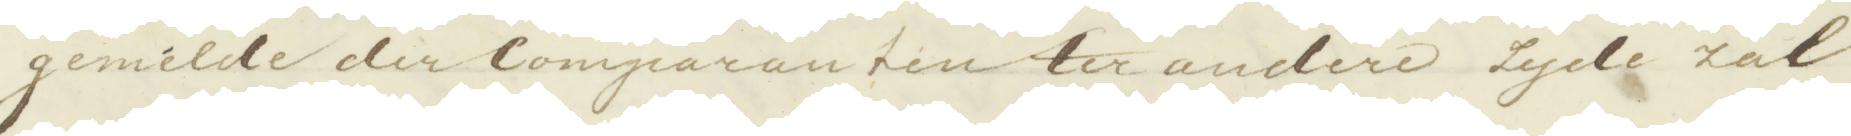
gemelde der Comparanten ter andere zyde zal
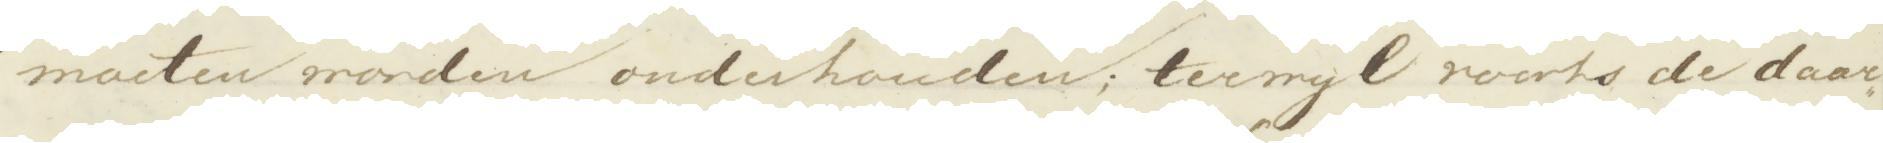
moeten worden onderhouden; terwijl voorts de daar„
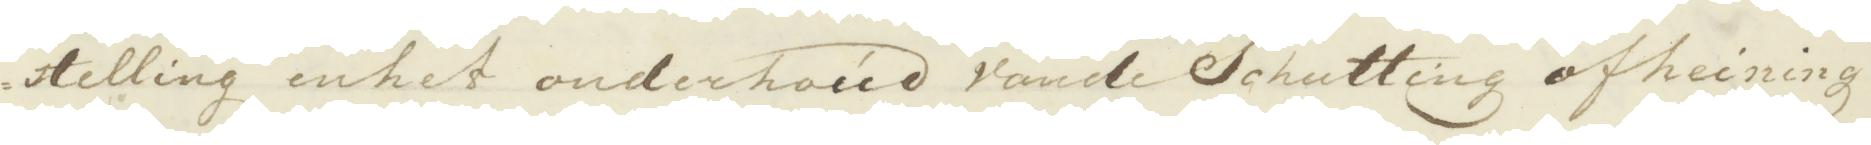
=stelling en het onderhoud van de Schutting of heining
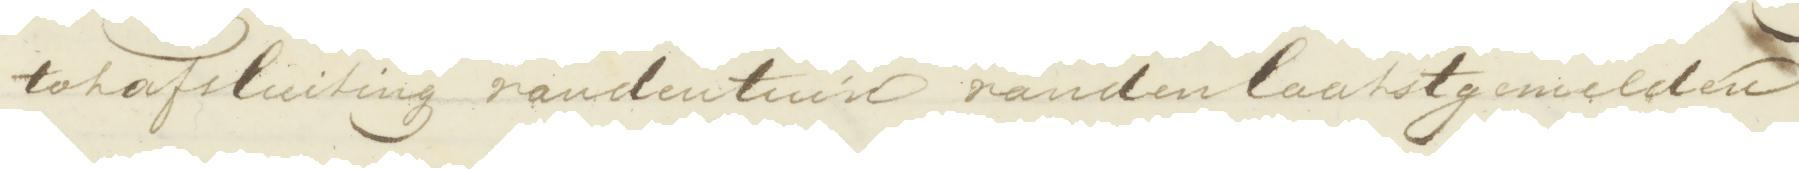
tot afsluiting van den tuin van den laatstgemelden
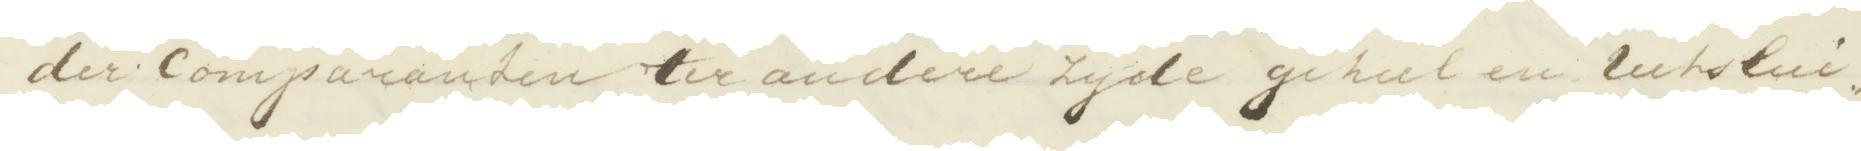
der Comparanten ter andere zijde geheel en uitslui„
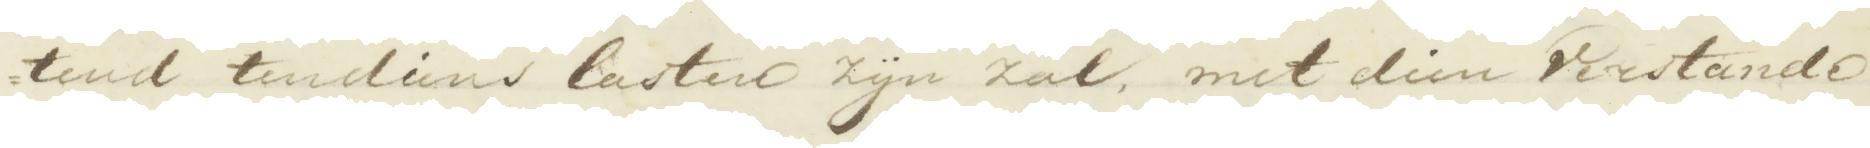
=tend ten diens lasten zijn zal, met dien verstande
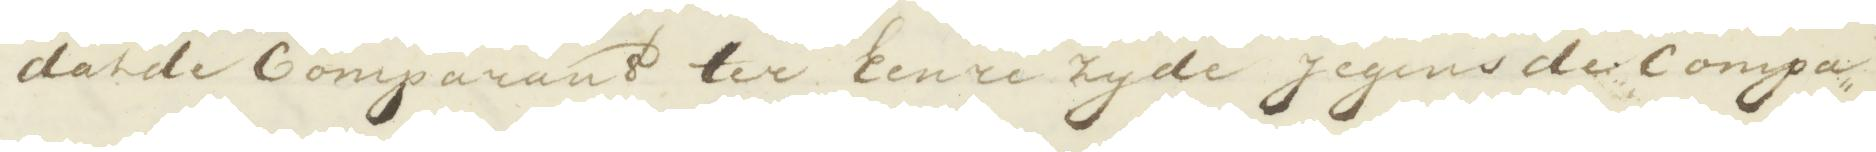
dat de Comparant ter Eenre zyde jegens de Compa„
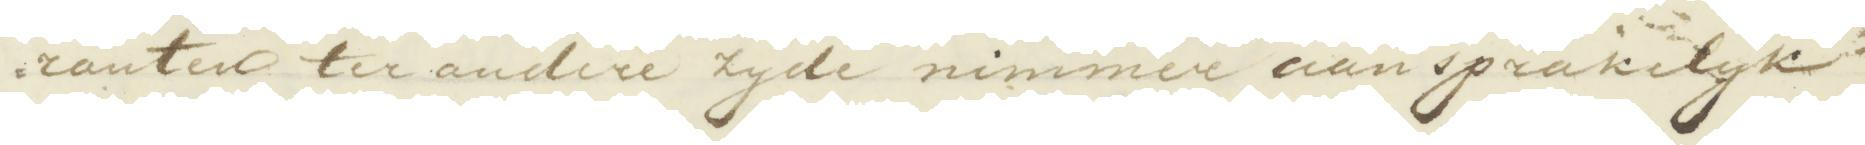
=ranten ter andere zyde nimmer aansprakelyk
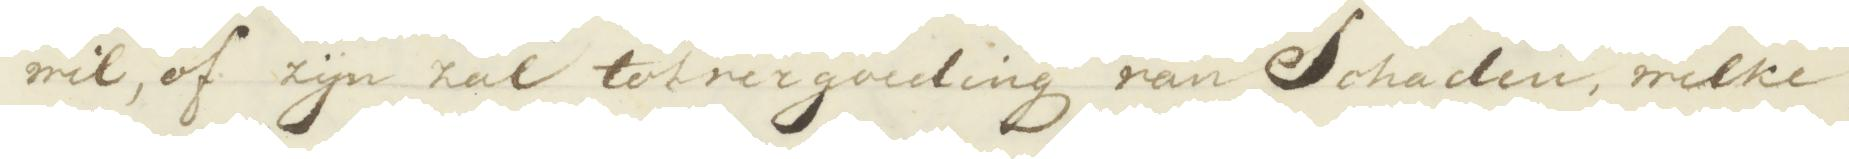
wil, of zijn zal tot vergoeding van Schaden, welke
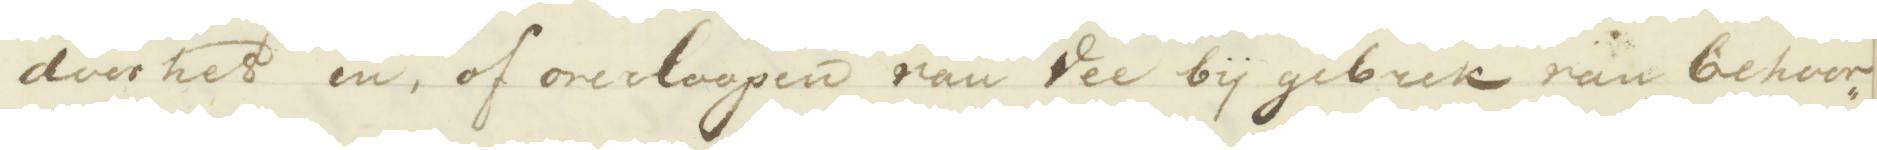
door het in, of overloopen van Vee bij gebrek van behoor„
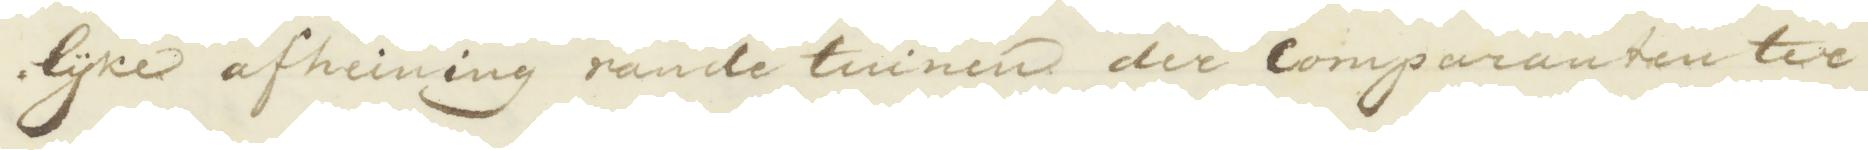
„lijke afheining van de tuinen der Comparanten ter
